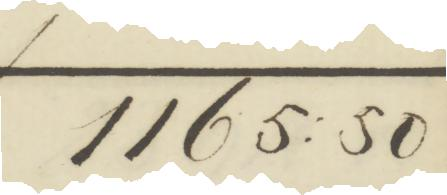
1165:50
